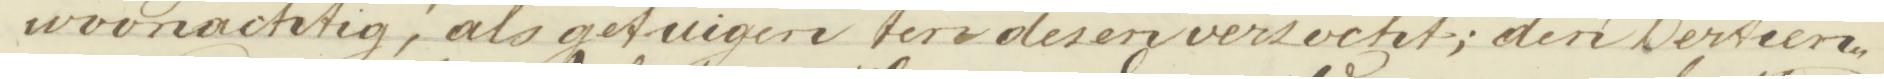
woonachtig, als getuigen ten dezen verzocht; den Dertien„
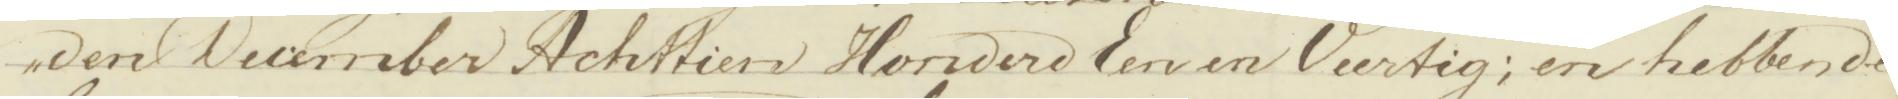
„den December Achttien Honderd Een en Veertig; en hebbende
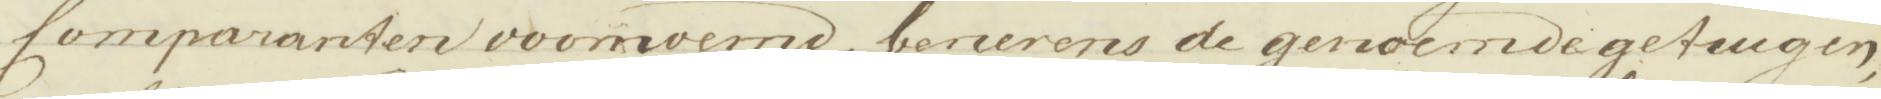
Comparanten voornoemd, benevens de genoemde getuigen,
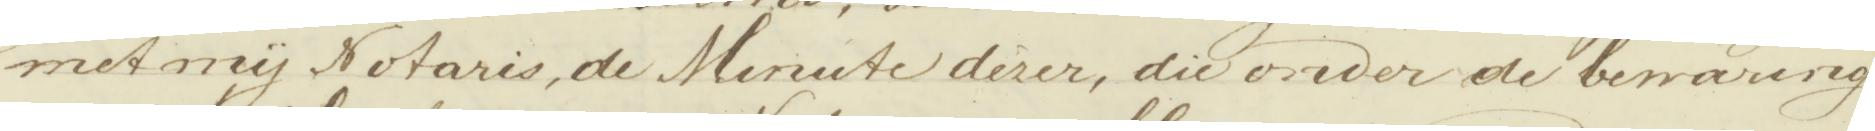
met mij Notaris, de Minute dezer, die onder de bewaring
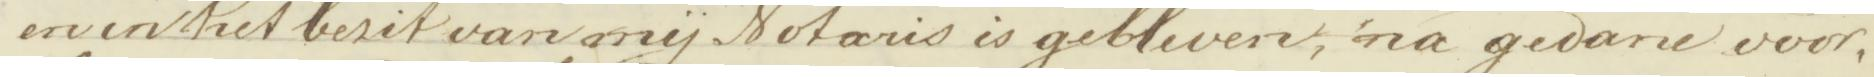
en in het bezit van mij Notaris is gebleven, na gedane voor„
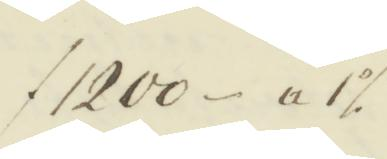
ƒ 1200 — a 1%
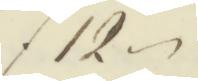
ƒ 12—
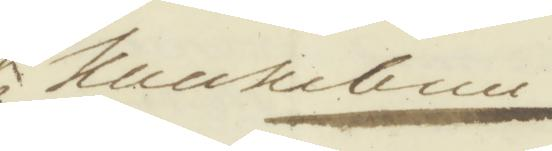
C: Kaakebeen
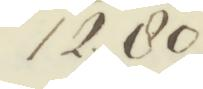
12.80
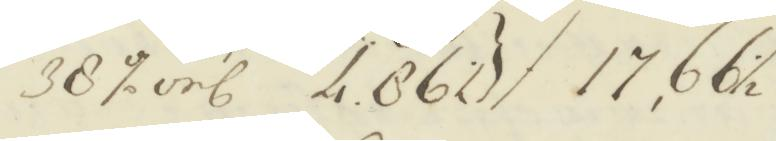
38% opc 4.86½ ƒ 17,66½
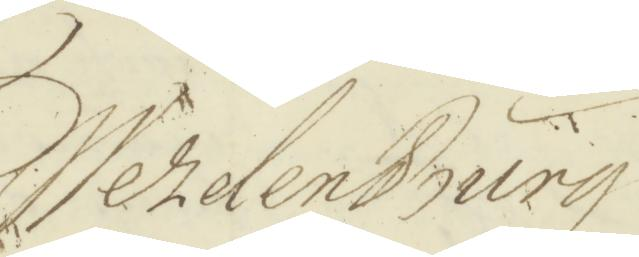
WezelenBurg
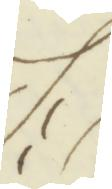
J:
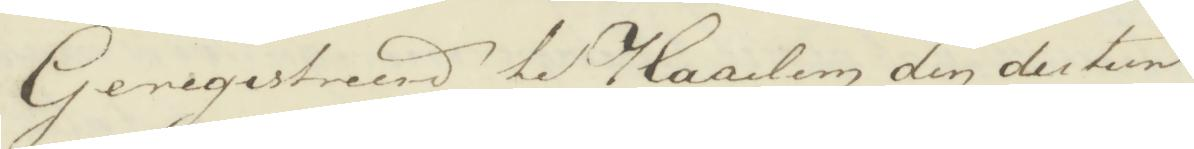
Geregistreerd te Haarlem den dertien
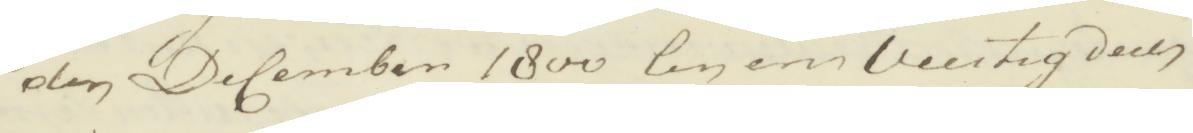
den December 1800 Een en veertig deel
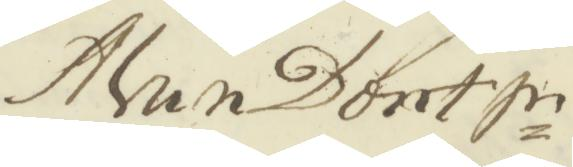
Van Dort j=r
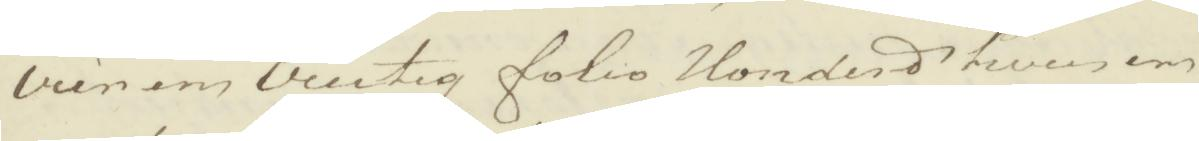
vier en veertig folio Honderd twee en
